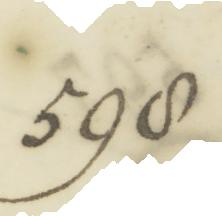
598
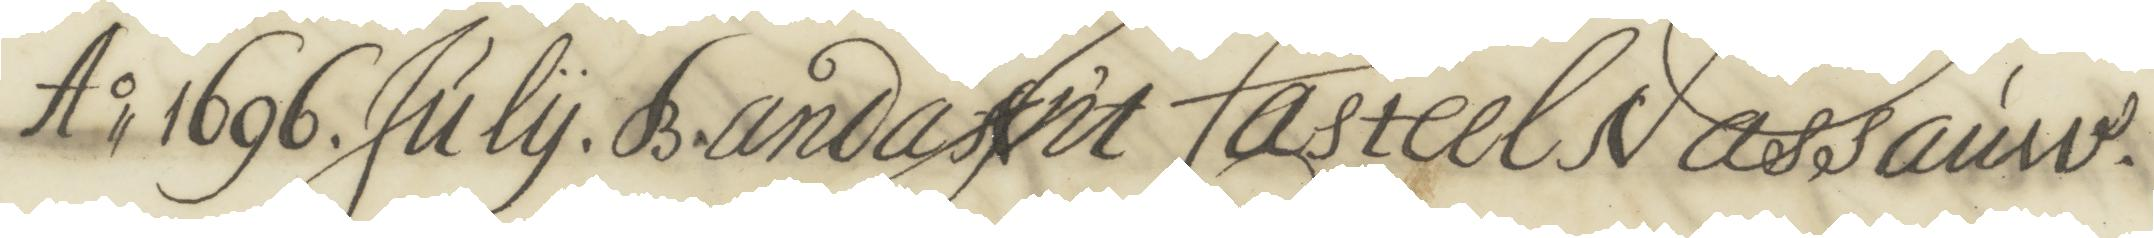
A„o 1696. Julij. Banda Jn't Casteel Nassauw.
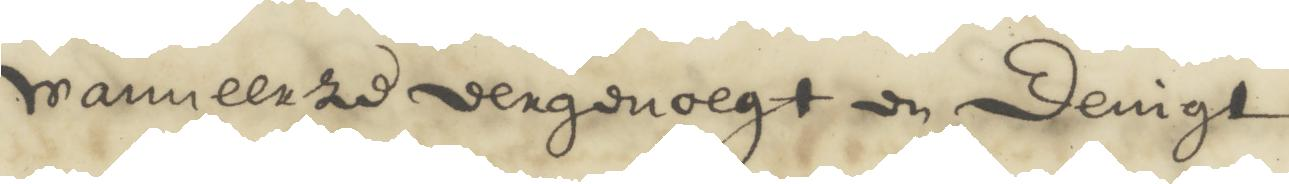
wanneer ze vergenoegt en Eenigt
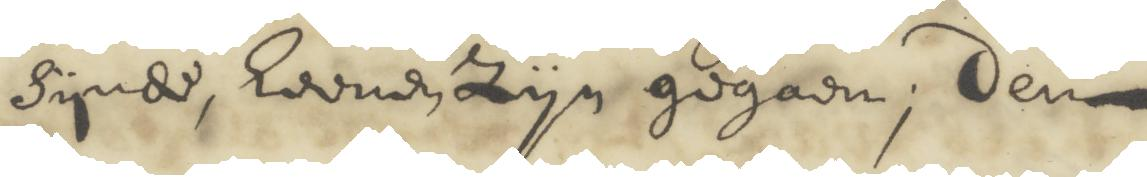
sijnde, heenen zijn gegaen; den
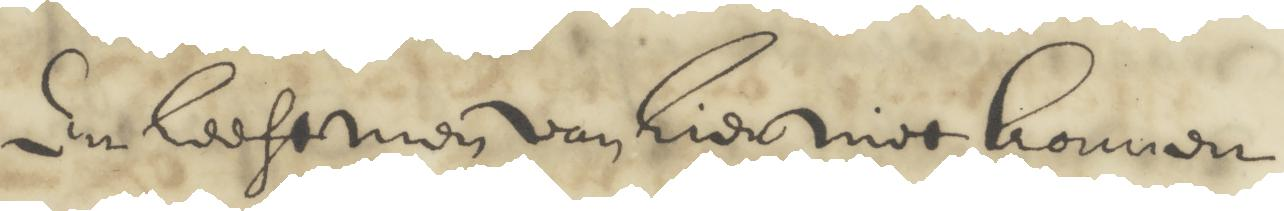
En heeft men van hier niet konnen
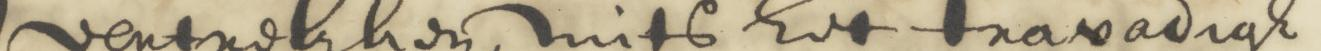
vertrekken, mits het travadigh
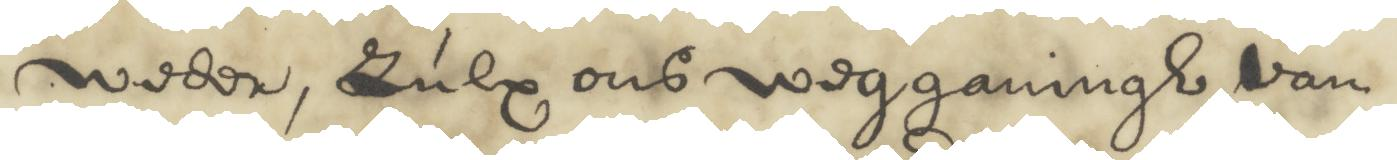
weder, zulx ons wegganingh van
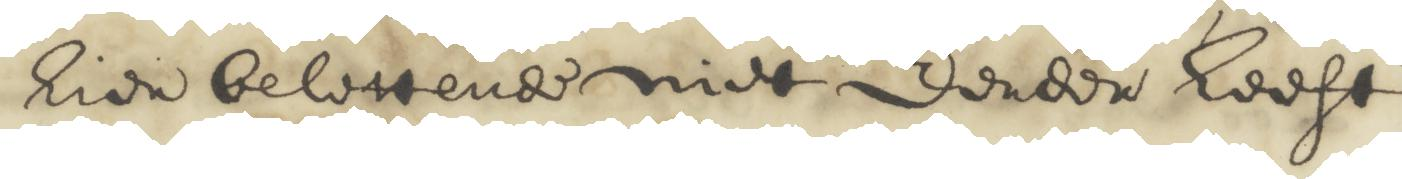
hier belettende niet Eerder heeft
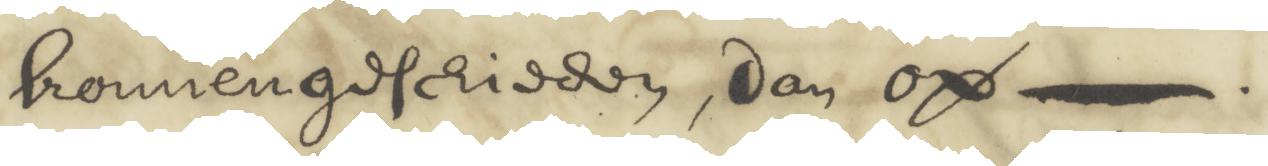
konnen geschieden, dan op —.
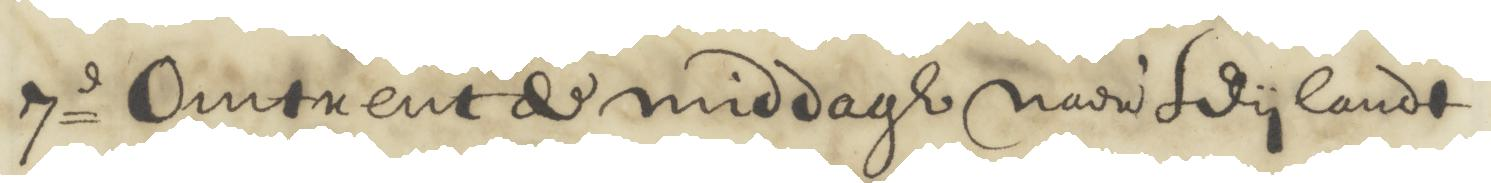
7=e Omtrent de middagh naer 't Eijlandt
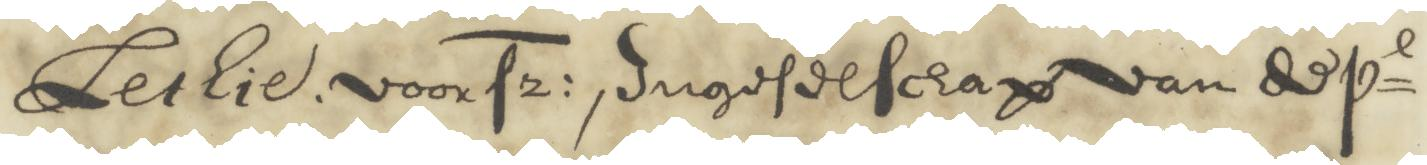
Lethie. voorsz:, Ingeselschap van de p=l
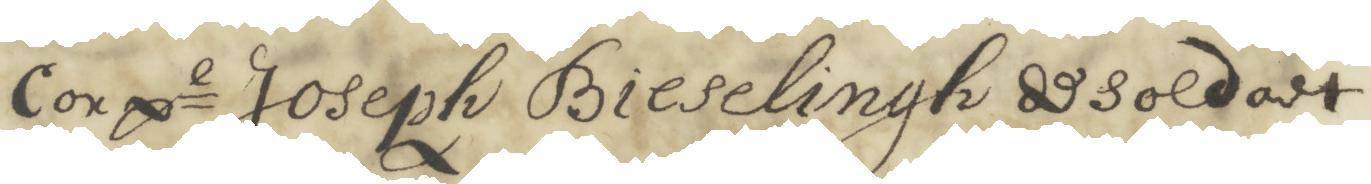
Corp=l Joseph Bieselingh de soldaet
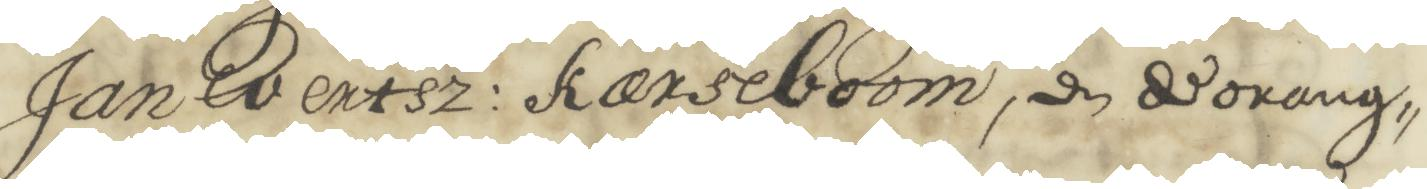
Jan Evertsz: karseboom, en de orang„
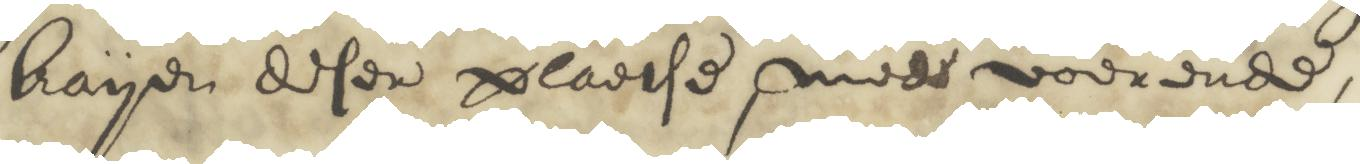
kaijen deser plaetse, mede voerende,
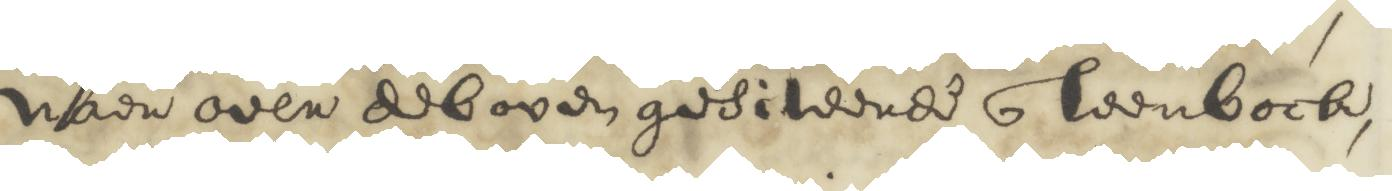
naer over de boven gesiteerde steenbock,
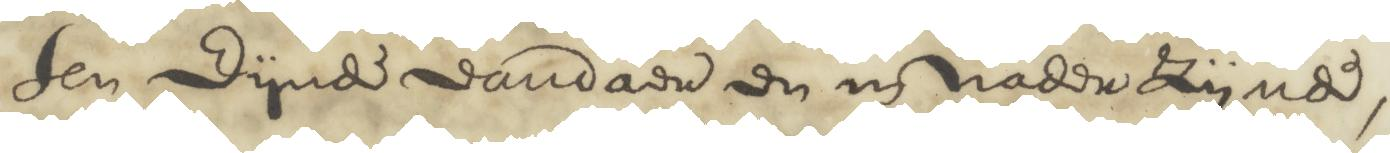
ten Eijnde vandaer en in nader zijnde,
